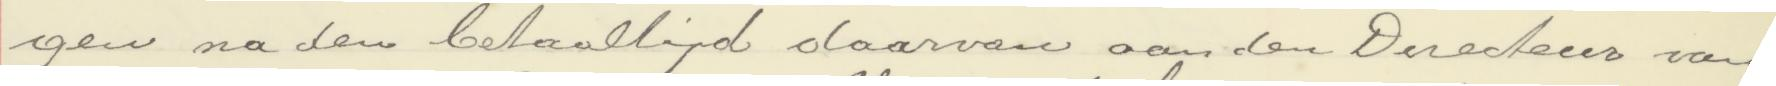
gen na den betaaltijd daarvan aan den Directeur van
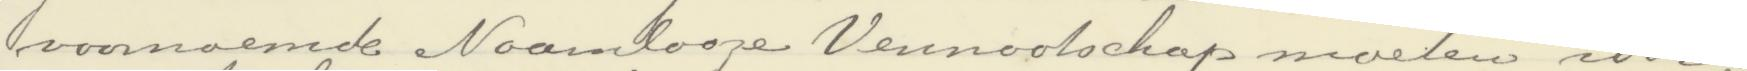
voornoemde Naamlooze Vennootschap moeten wor
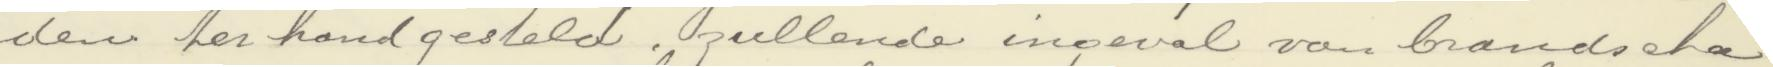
den ter hand gesteld, zullende ingeval van brandscha
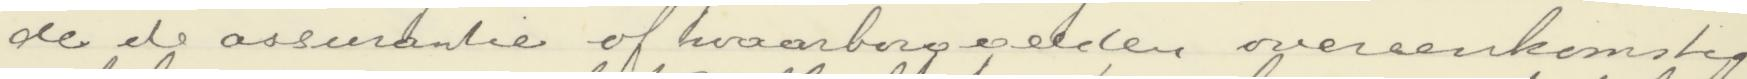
de de assurantie of waarborg elders overeenkomstig
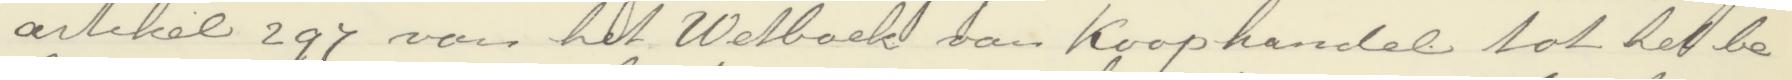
artikel 297 van het Wetboek van Koophandel tot het be
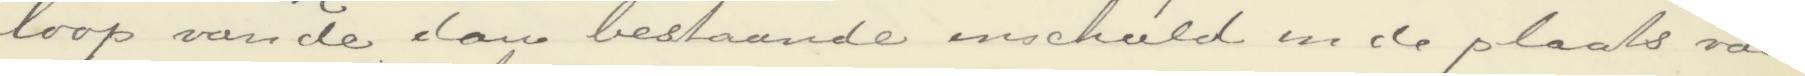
loop van de dan bestaande inschuld in de plaats van
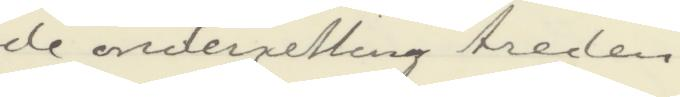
de onderzetting treden
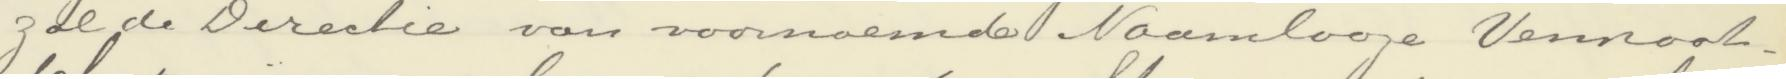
zal de Directie van voornoemde Naamlooze Vennoot-
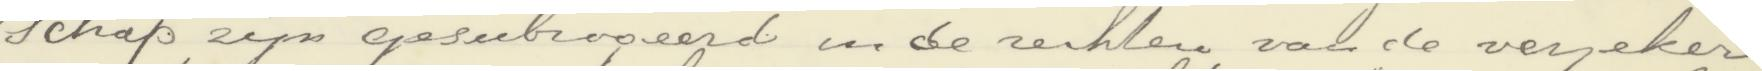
schap zijn gesubrogeerd in de rechten van de verzeker
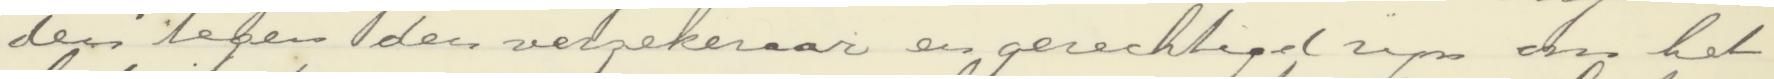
den tegen den verzekeraar en gerechtigd zijn om het
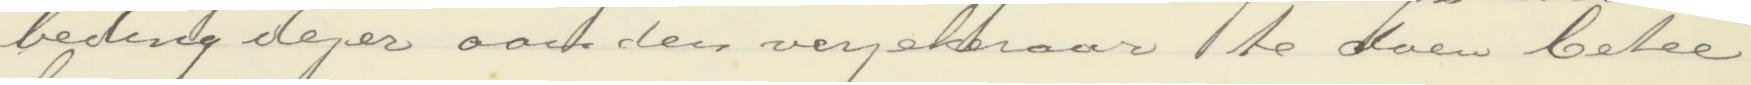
beding dezer aan den vezekeraar te doen betee
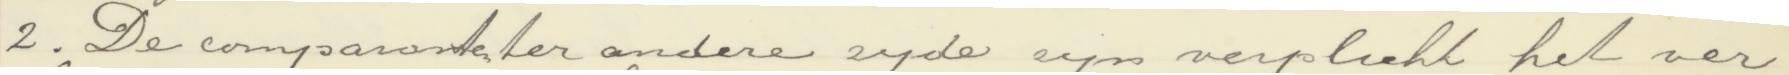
2. De comparante ter andere zyde zijn verplicht het ver
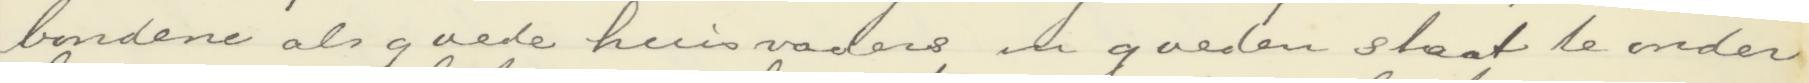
bondene als goede huisvaders in goeden staat te onder
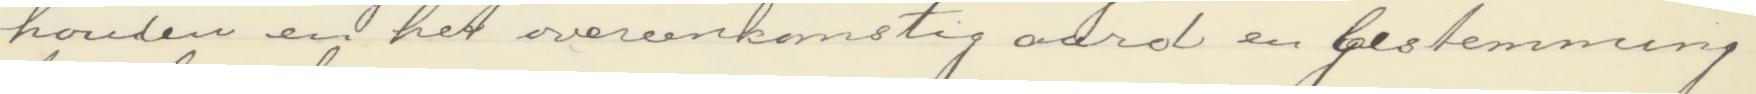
houden en het overeenkomstig aard en bestemming
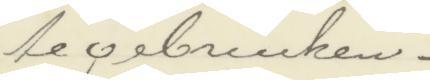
te gebruiken
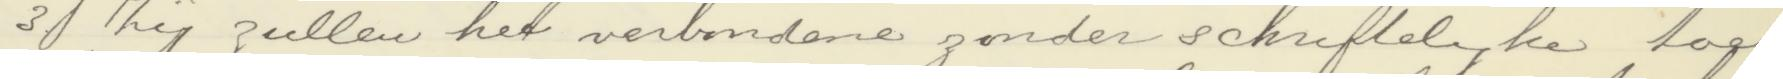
3 Zij zullen het verbondene zonder schriftelyke toe
